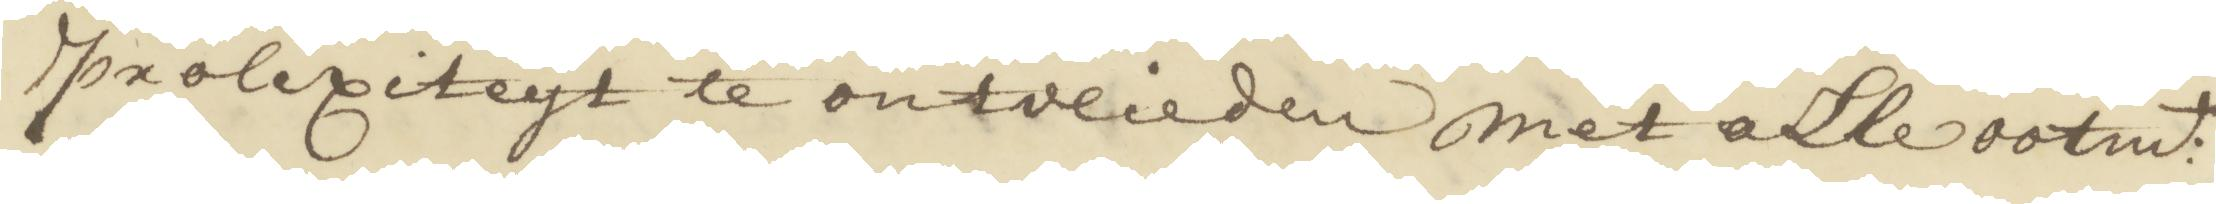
prolixiteijt te ontvlieden met alle ootmt:
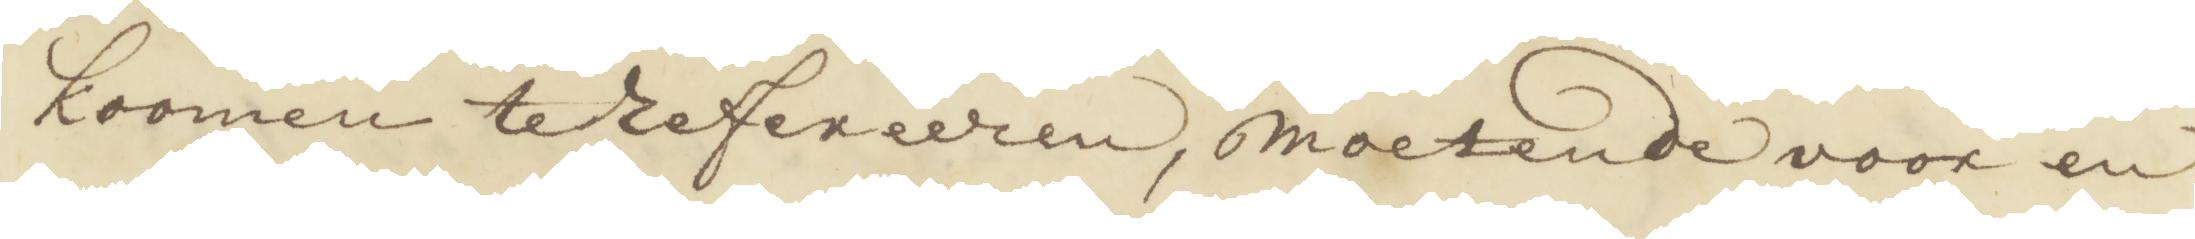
koomen te refereeren, moetende voor en
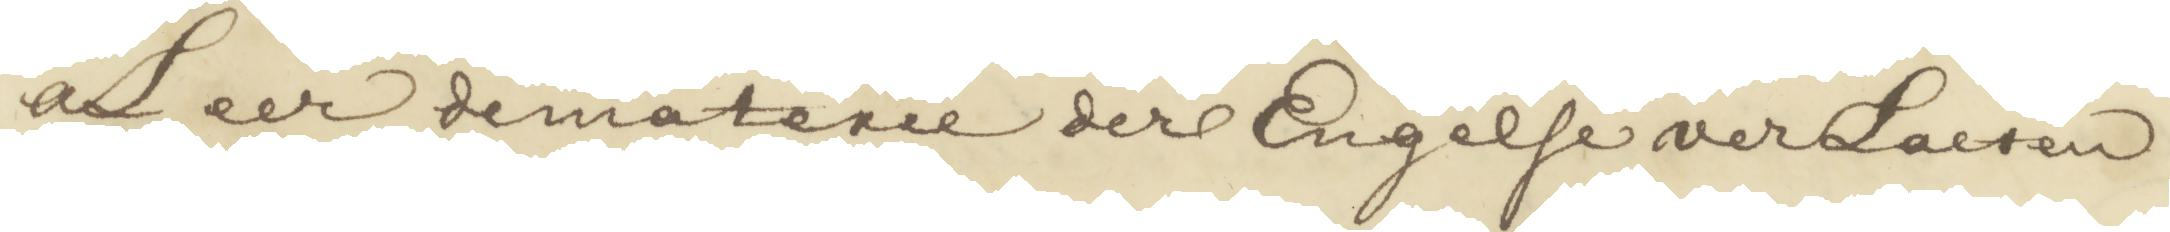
al eer dematerie der Engelse verlaeten
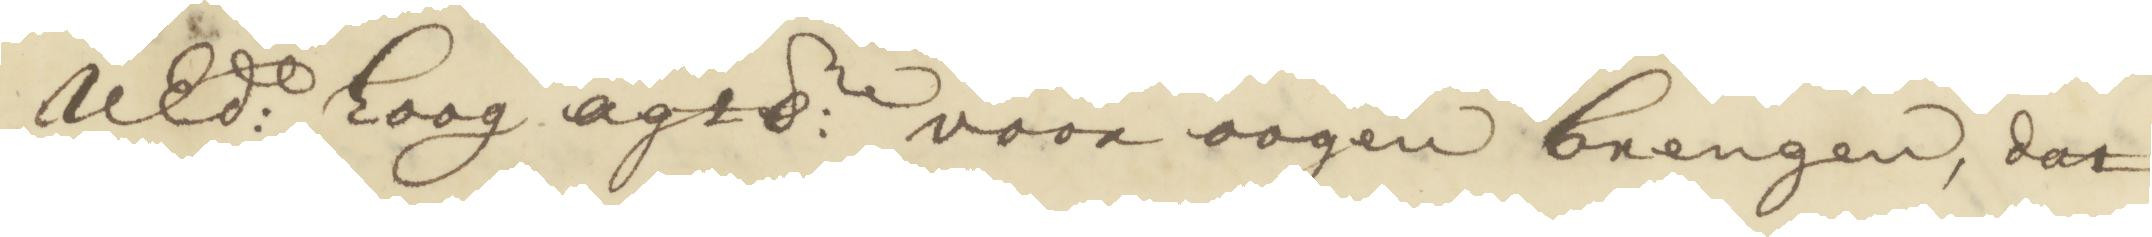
uEd:e hoog agtb:re voor oogen brengen, dat
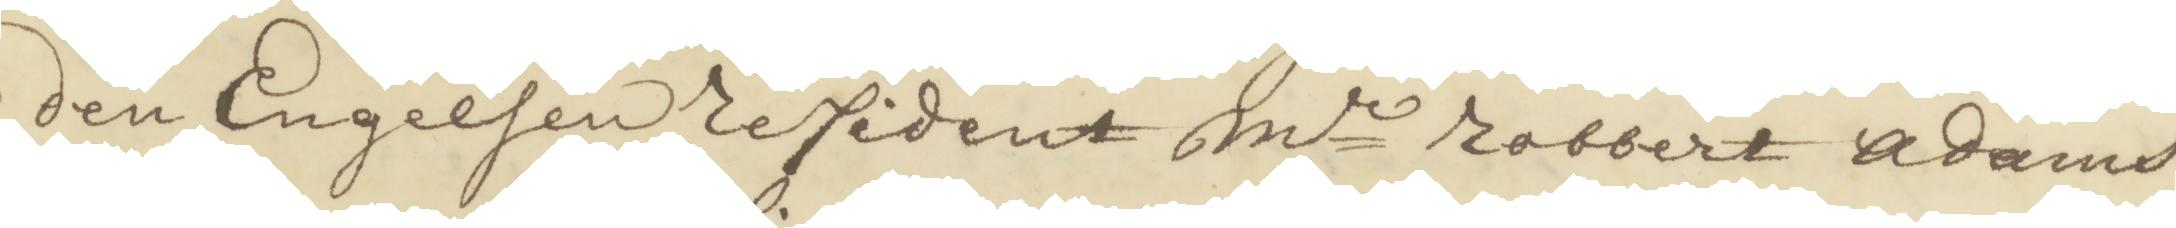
den Engelsen resident m=r robbert adams
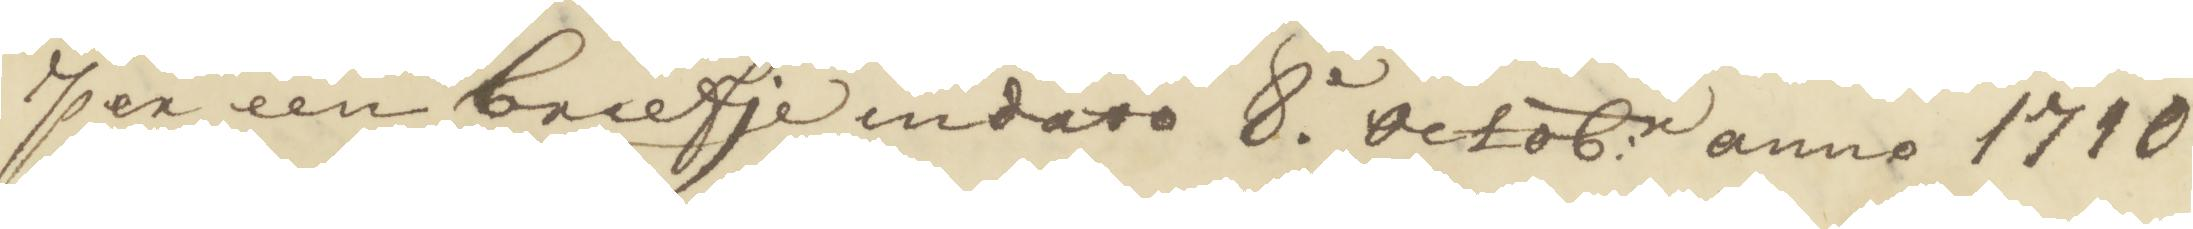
per een briefje in dato 8.e octob:r anno 1710
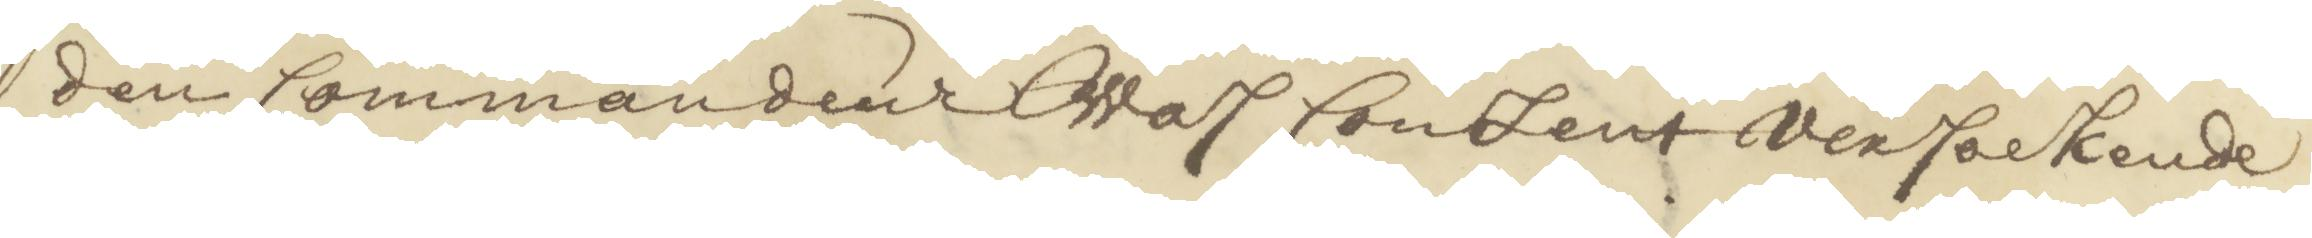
den Commandeur was Consent versoekende
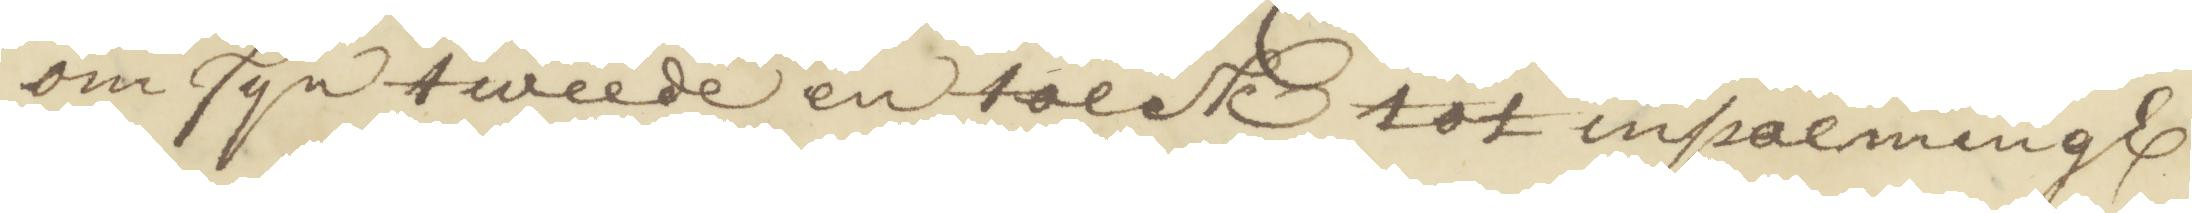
om syn tweede en tolck tot inpalmingh
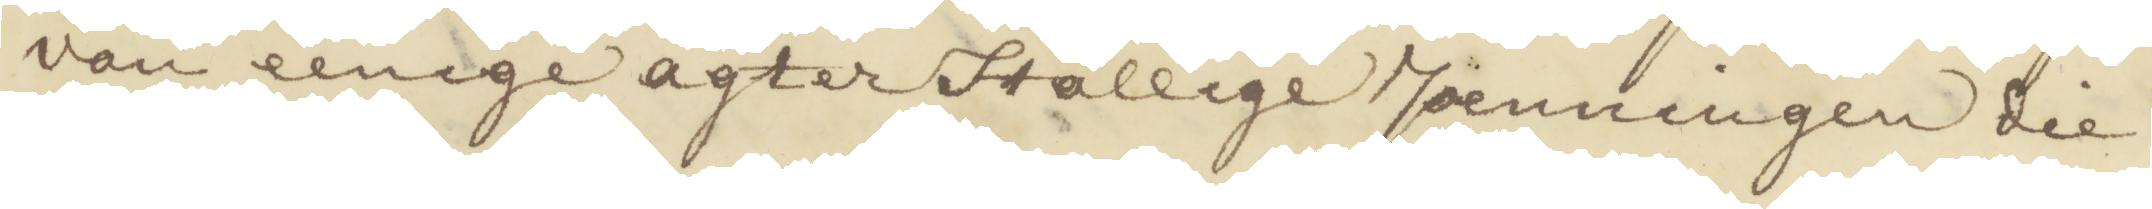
van eenige agterstallige penningen die
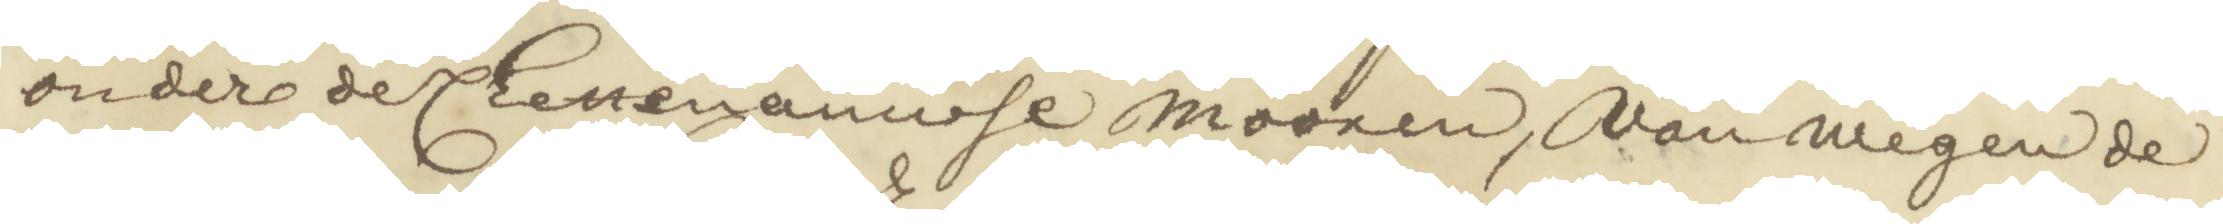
onder de Chettenauwse mooren, van wegen de
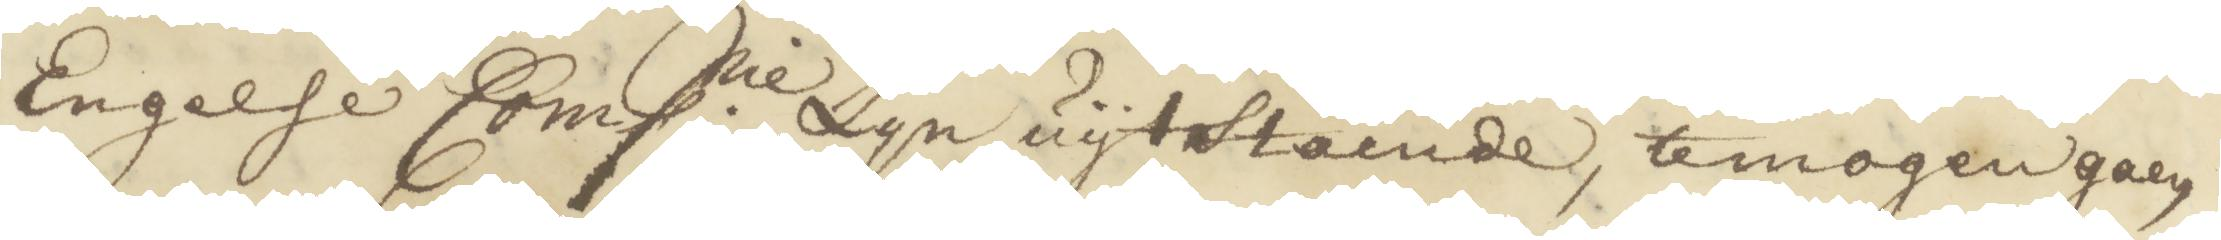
Engelse Comp:ie zyn uijtstaende, temogen gaen
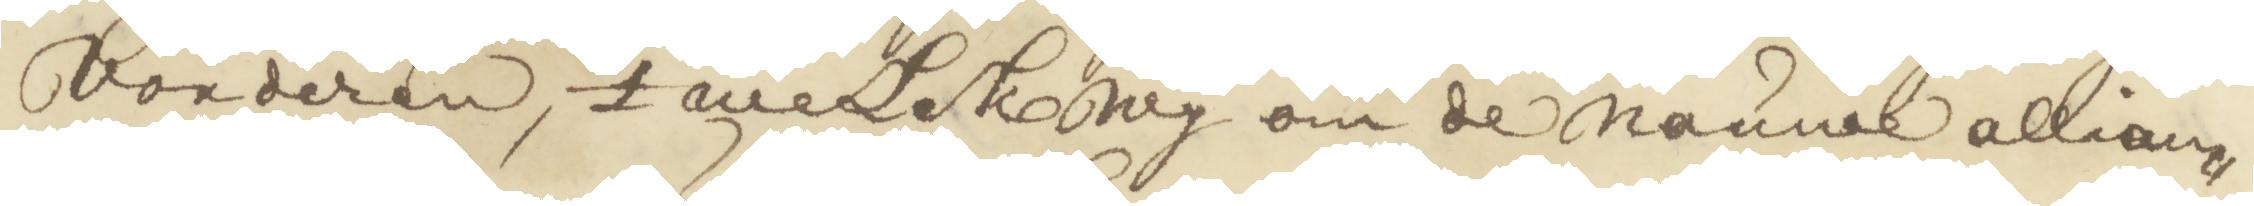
vorderen, t welck wij om de nauwe allian„
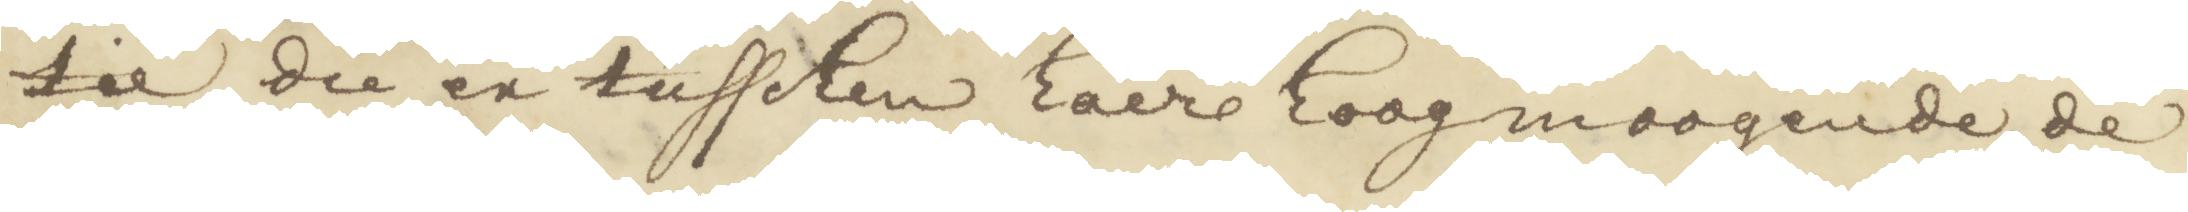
tie, die er tusschen haer hoog moogende, de
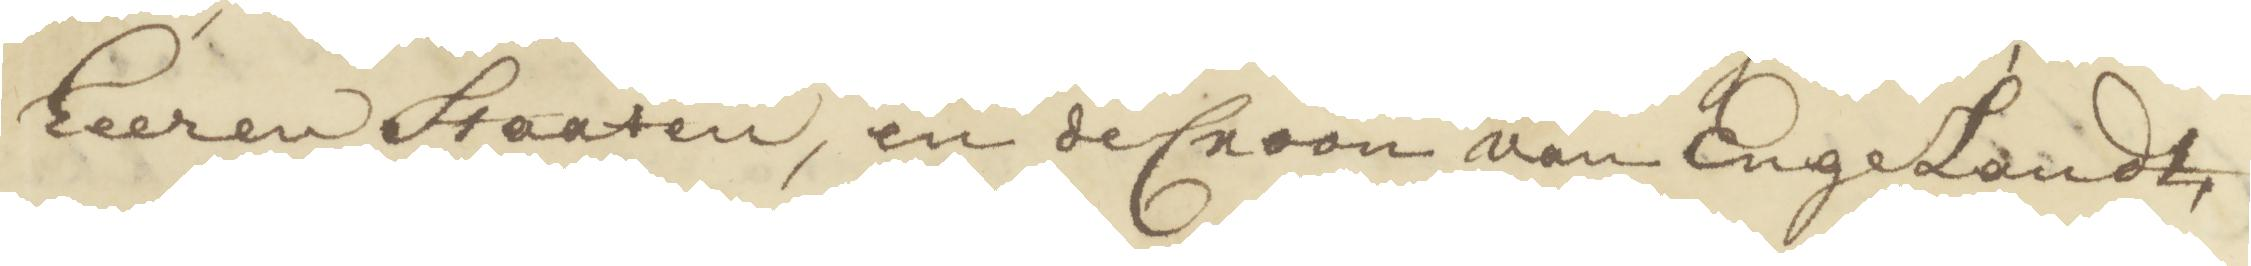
heeren staaten, en de Croon van Engelandt,
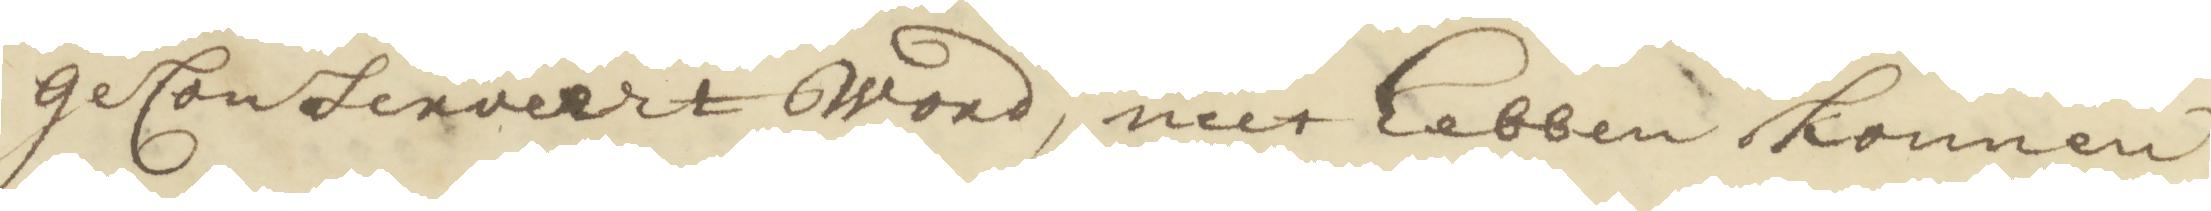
geconserveert word, niet hebben konnen
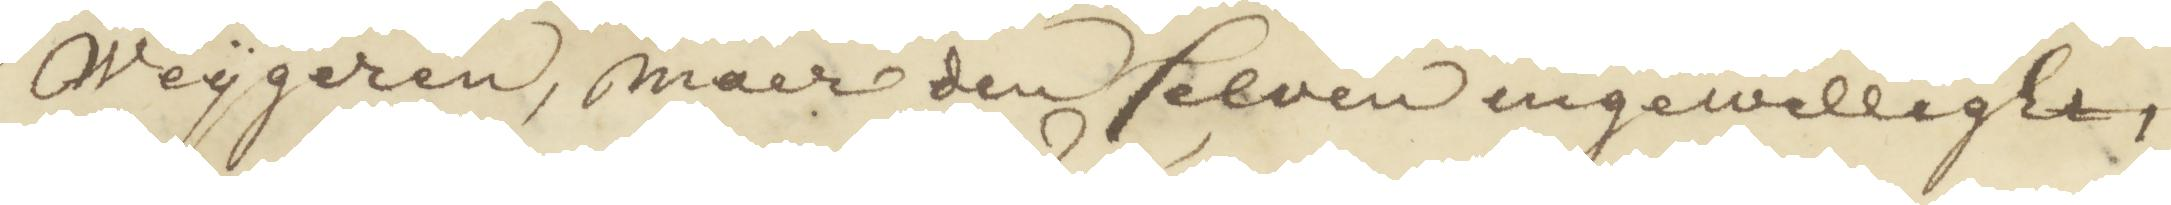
weijgeren, maer den selven ingewillight,
